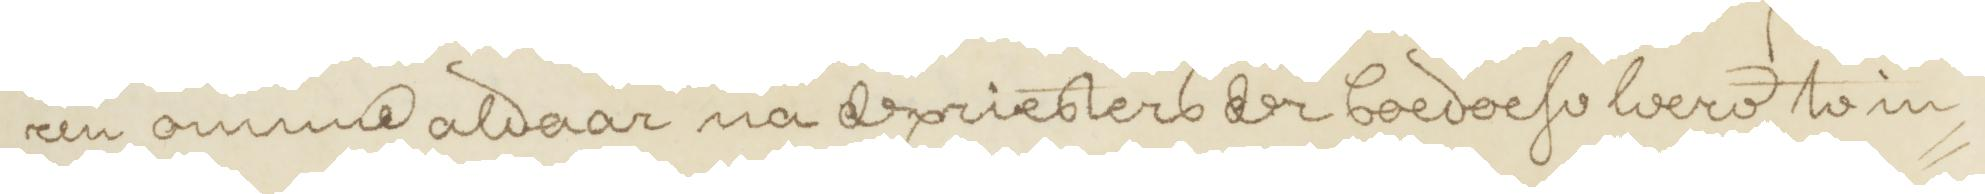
ren omme aldaar na de priesters der boedoese leere te in„
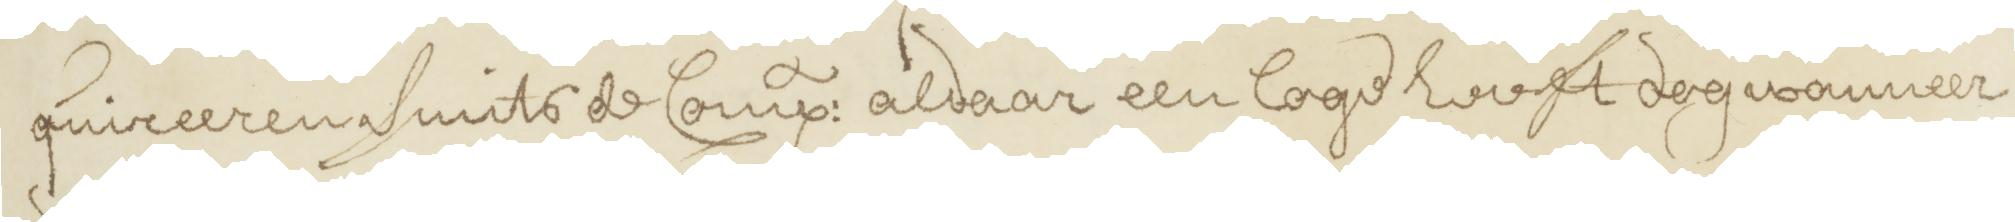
quireeren vermits de Comp: aldaar een loge heeft dog wanneer
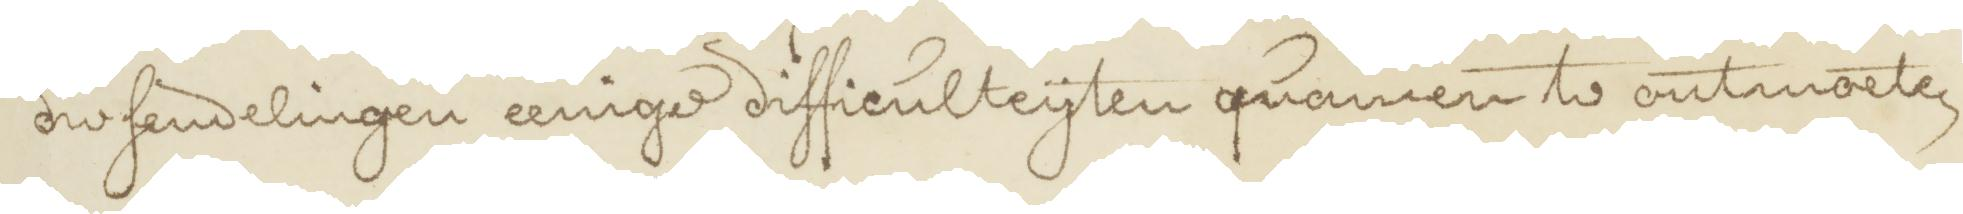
die sendelingen eenige difficulteijten quamen te ontmoeten
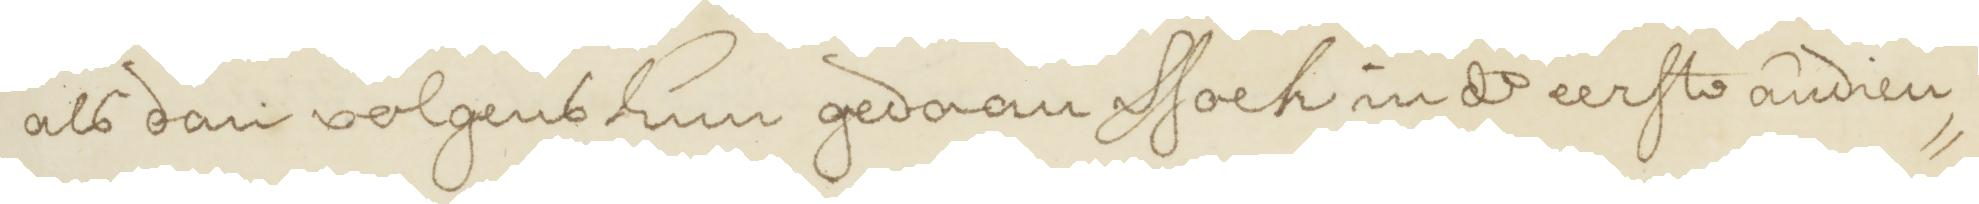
als dan volgens hun gedaan versoek in de eerste audien„
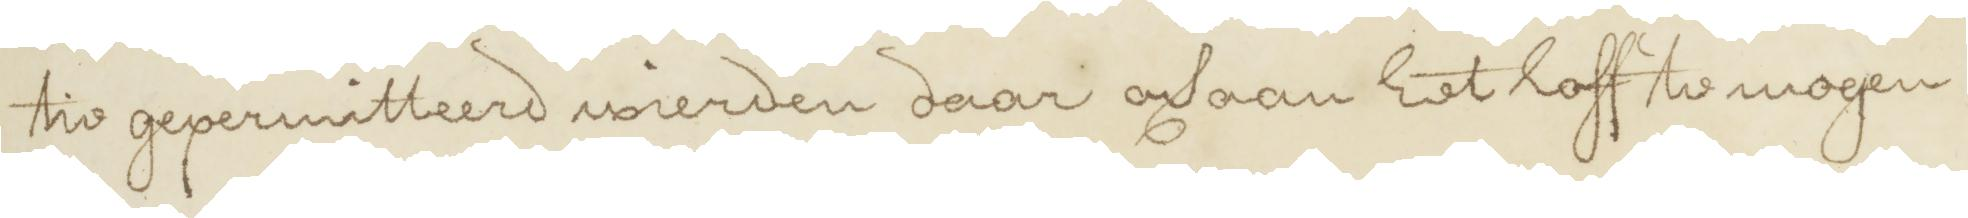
tie gepermitteerd wierden daar over aan het hoff te mogen
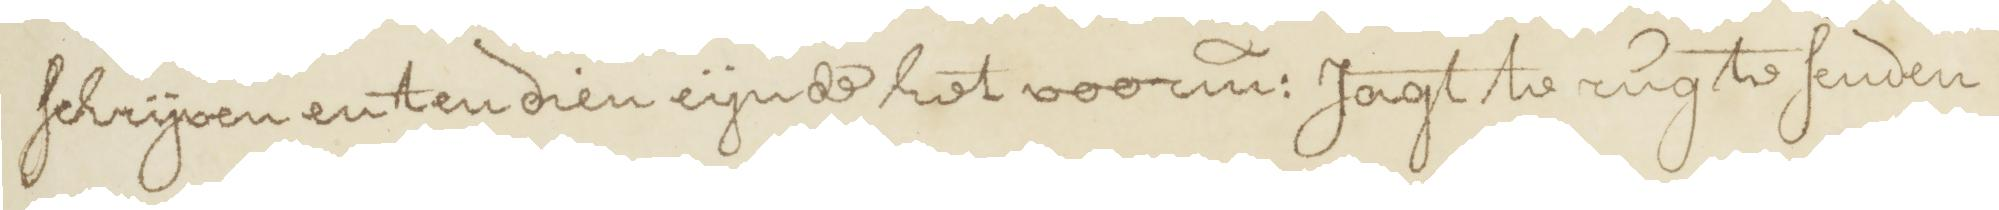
schrijven en ten dien eijnde het voorm: Jagt te rug te senden
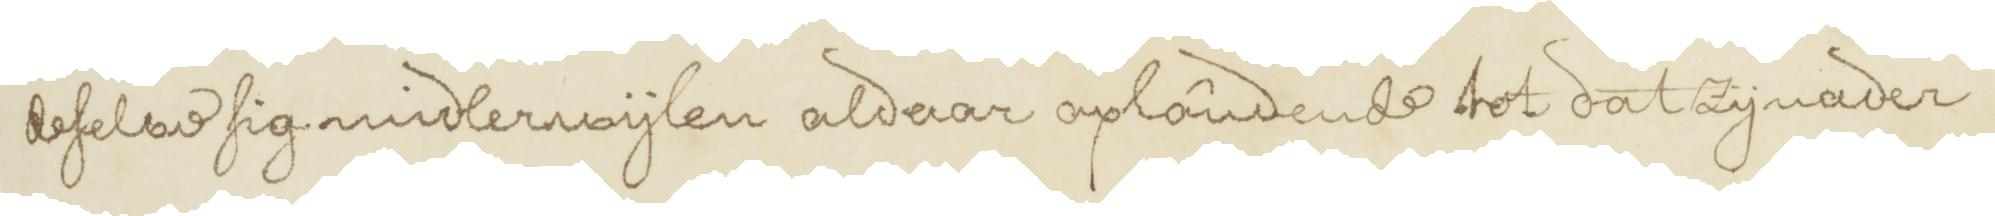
deselve sig midlerwijlen aldaar ophoudende tot dat zij nader
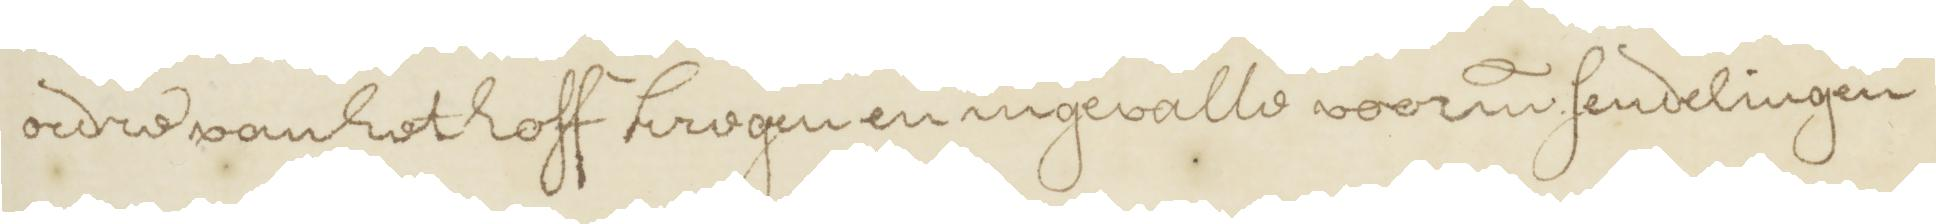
ordre van het hoff kregen en ingevalle voorm: sendelingen
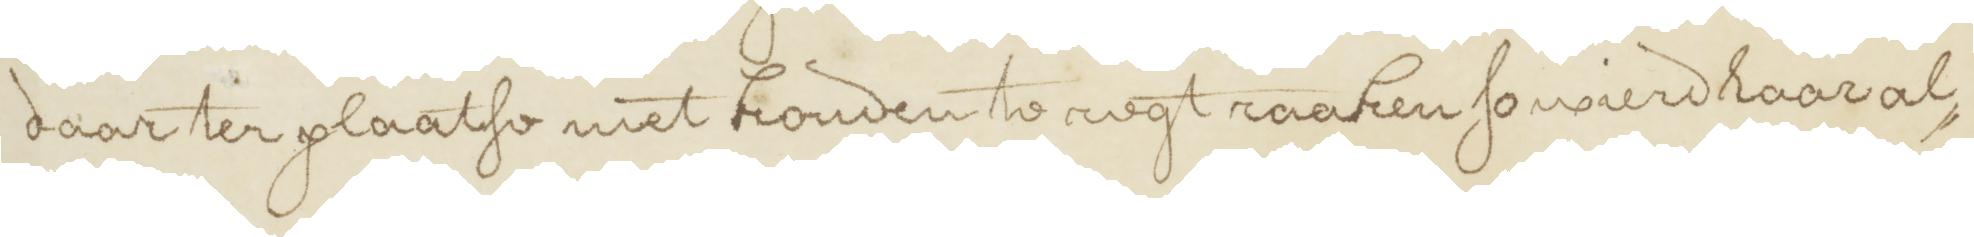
daar ter plaatse niet konden te regt raaken so wierd haar al„
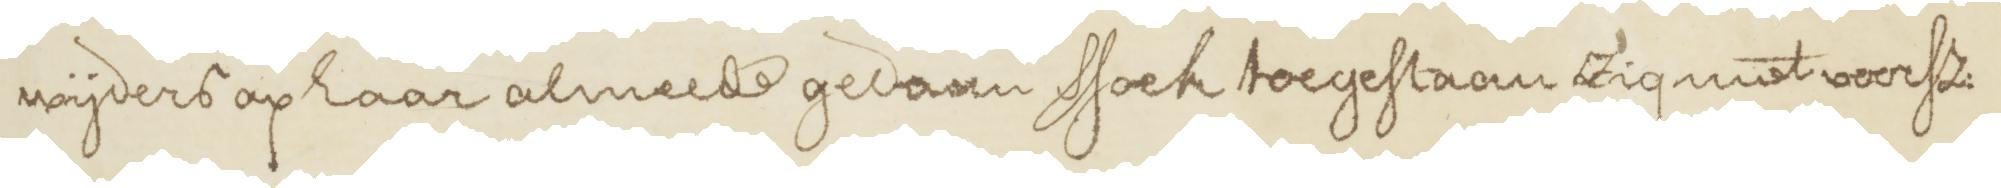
wijders op haar almeede gedaan versoek toegestaan zig met voorsz:
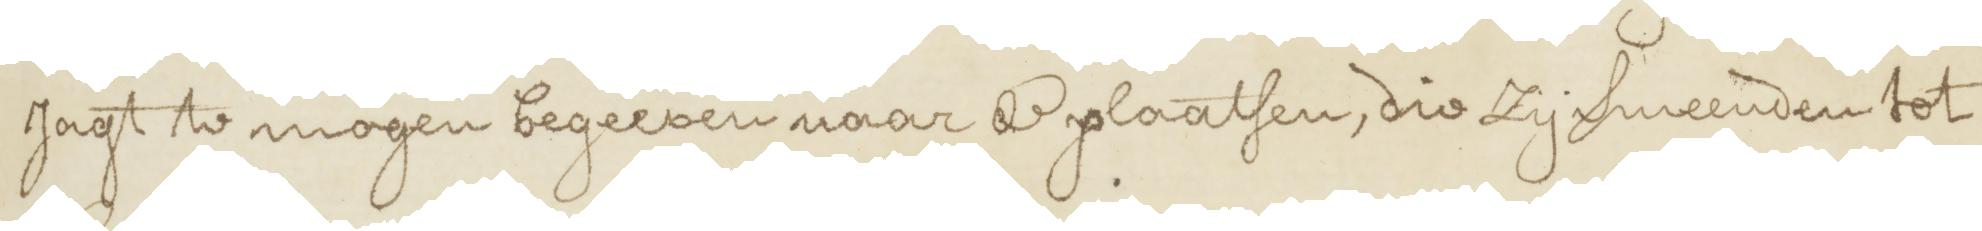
Jagt te mogen begeeven naar de plaatsen, die zij vermeenden tot
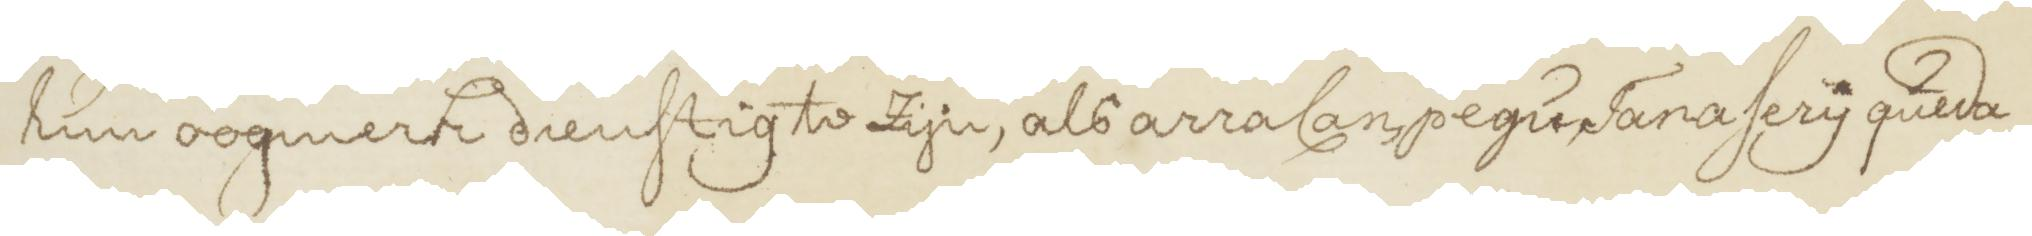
hun oogmerk dienstig te zijn, als arraCan, pegu, Tana serij queda
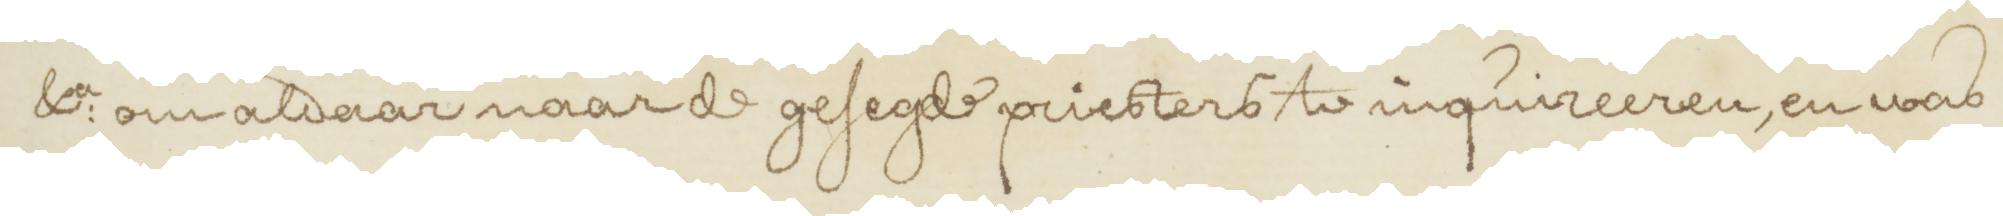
&:a om aldaar naar de gesegde priesters te inquireeren, en was
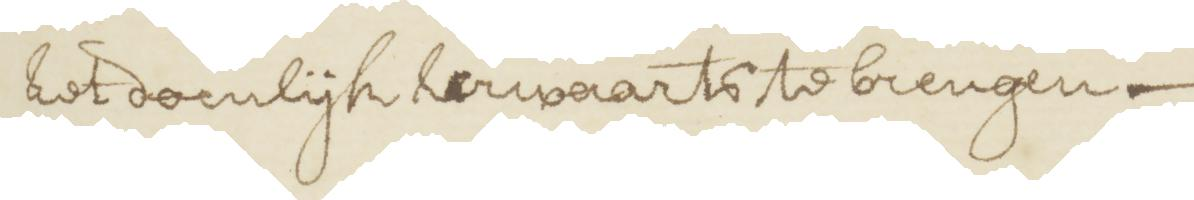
het doenlijk herwaarts te brengen.
